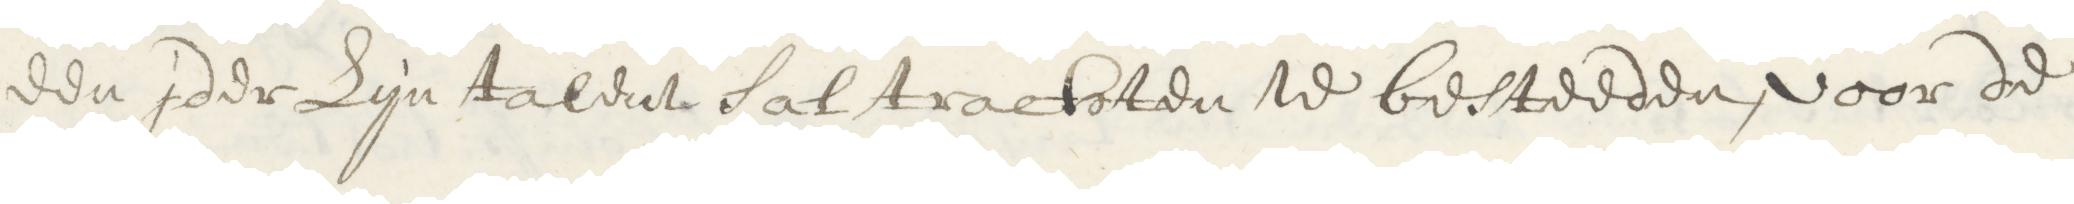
een jder zijn talent sal trachten te besteeden, voor de
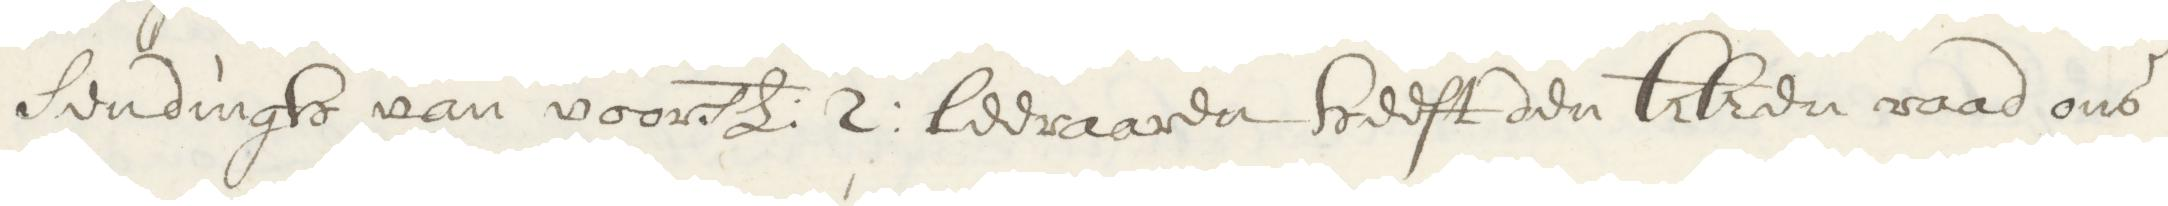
sendingh van voorsz: 2: leeraaren heeft den kken raad ons
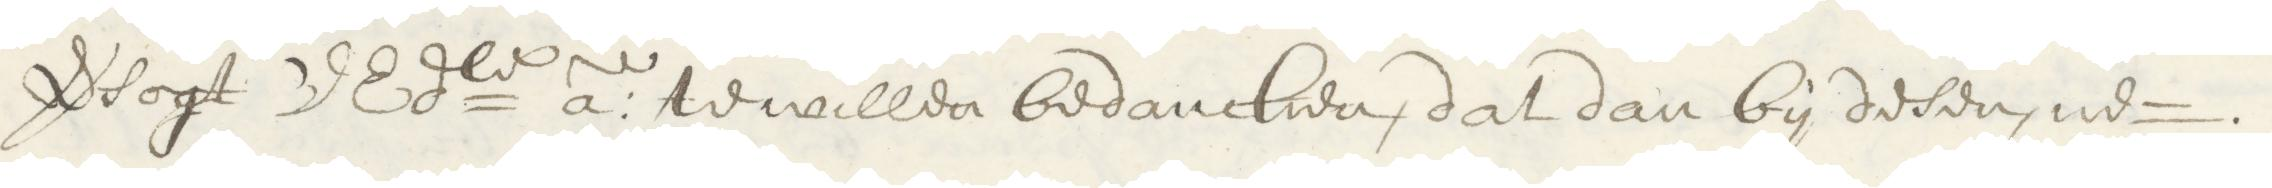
versogt VEd=le a: tewillen bedancken, dat dan bij desen, ne=
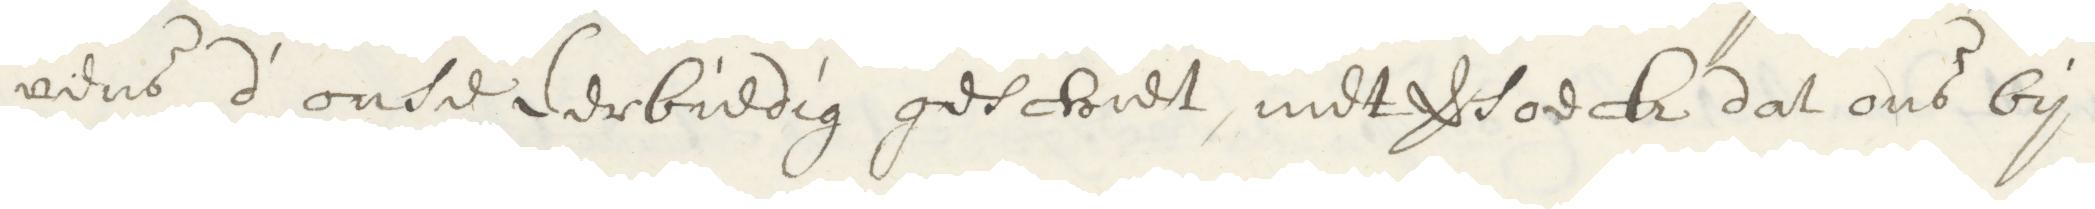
vens d’ onse Eerbiedig geschiet, met versoeck dat ons bij
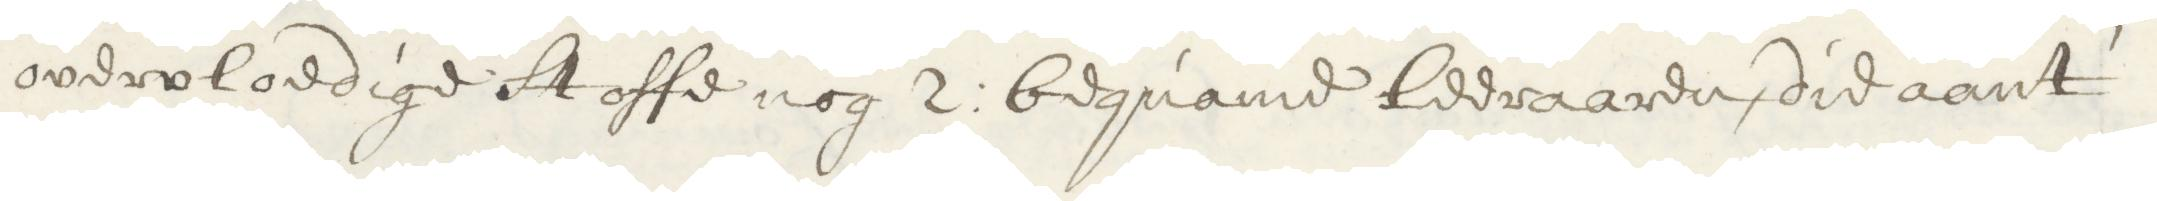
overvloedige stoffe nog 2: bequame leeraaren, die aant'
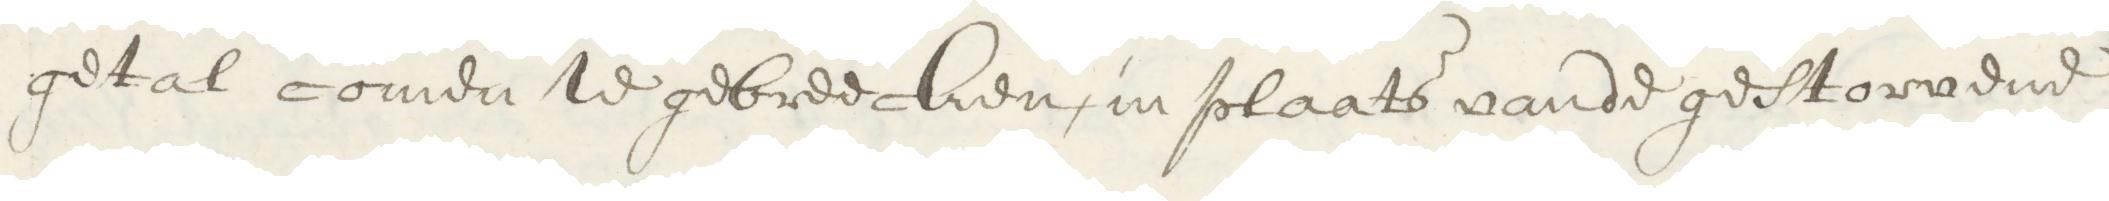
getal comen te gebreecken, in plaats vande gestorvene
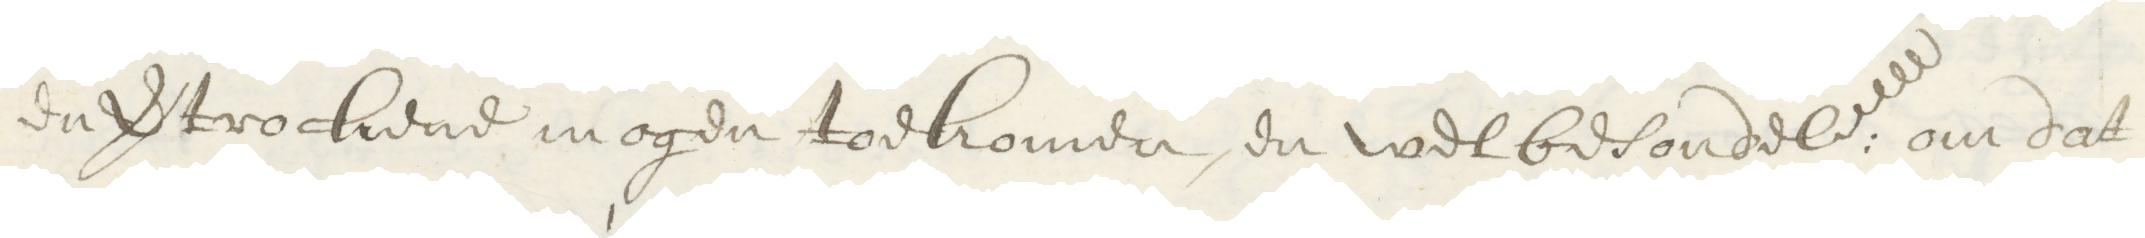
en vertrockene mogen toekomen, en wel besondelijk om dat
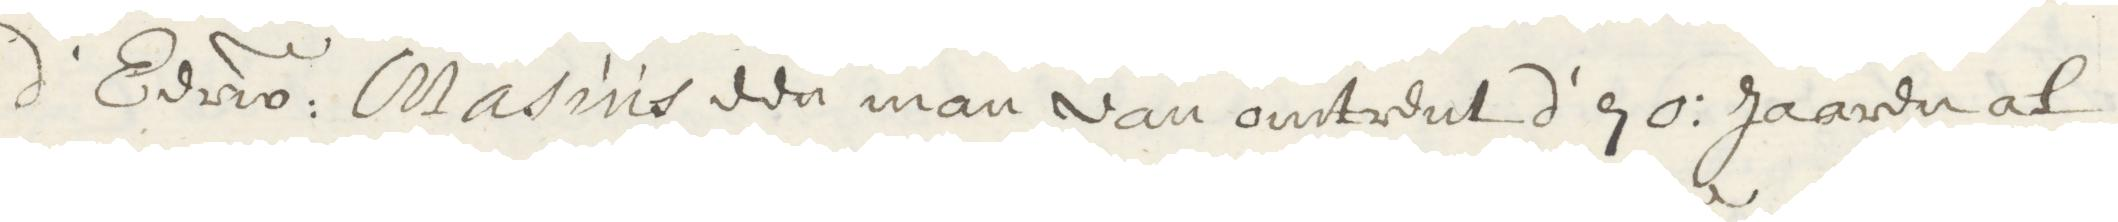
d’ Eerw: Masius een man van omtrent d’ 70: Jaaren al
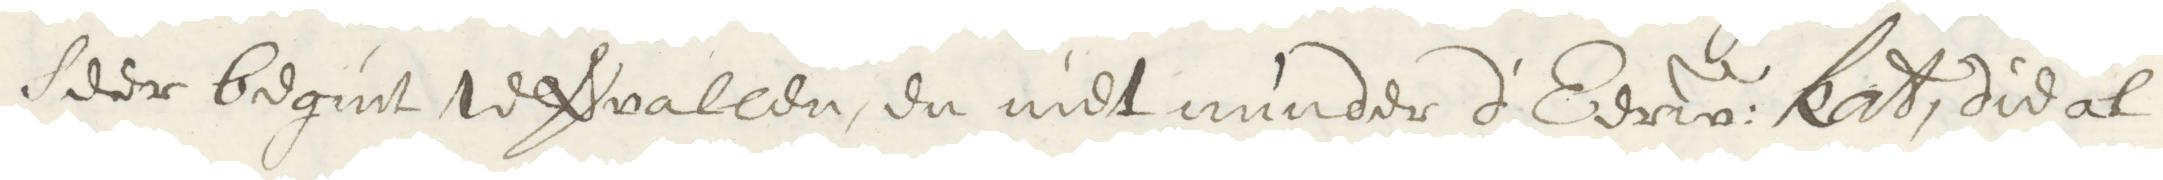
seer begint te vervallen, en niet minder d’ Eerw: kat, die al
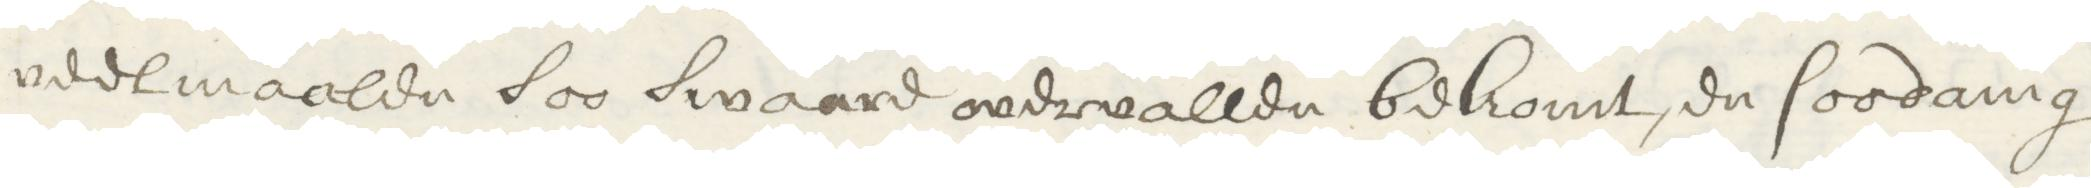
veel maalen soo swaare overvallen bekomt, en soodanig
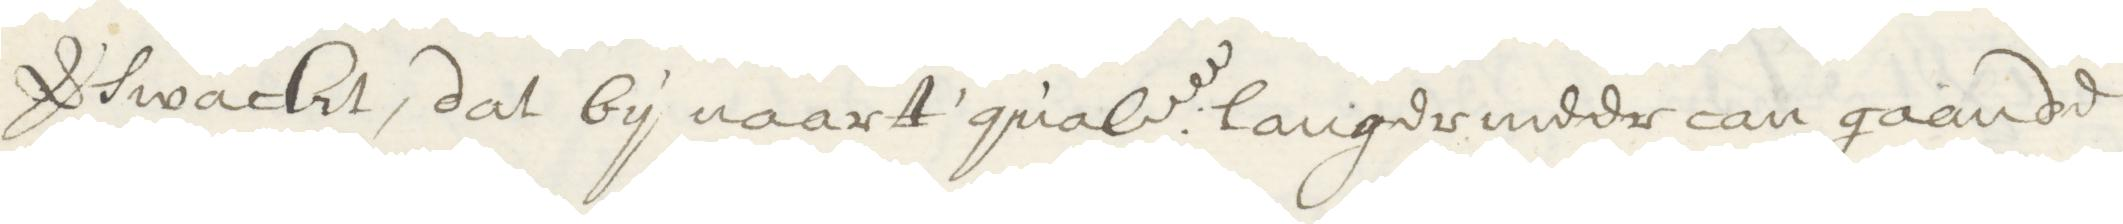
verswackt, dat bij naar t' qualijk langer meer can gaande
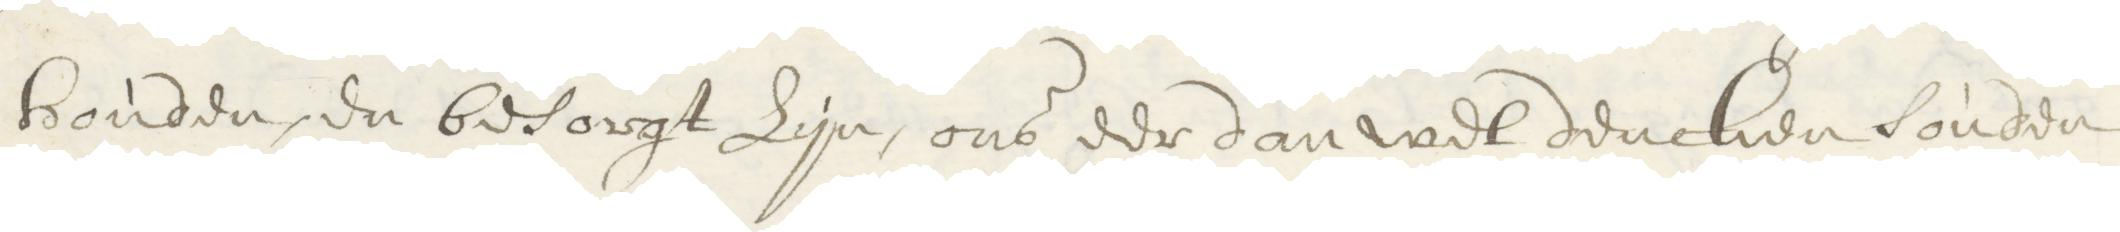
houden, en besorgt zijn, ons eer dan wel dencken souden
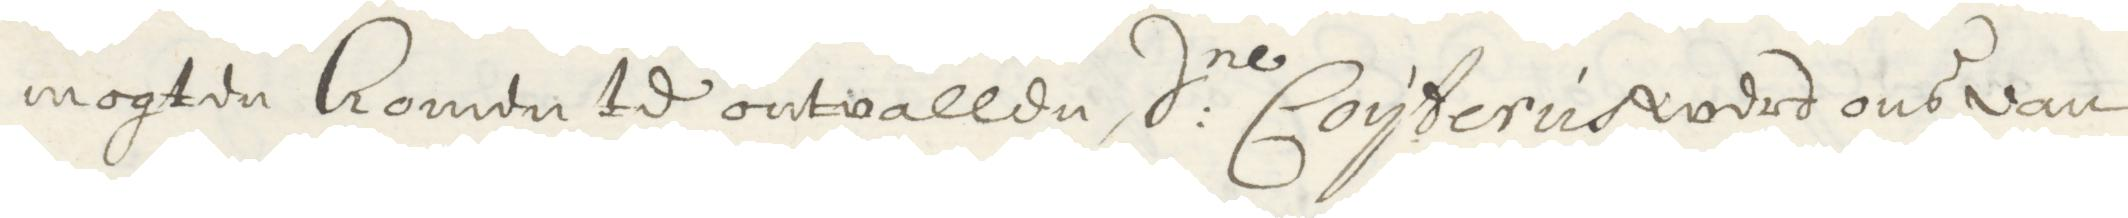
mogten komen te ontvallen, d:ne Coijterus werd ons van
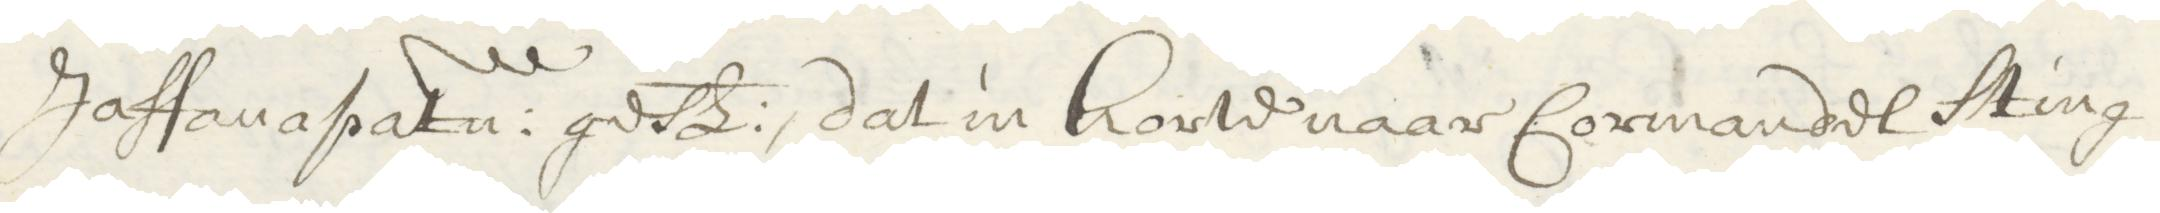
Jaffanapatn: gesz:, dat in korte naar Cormandel sting
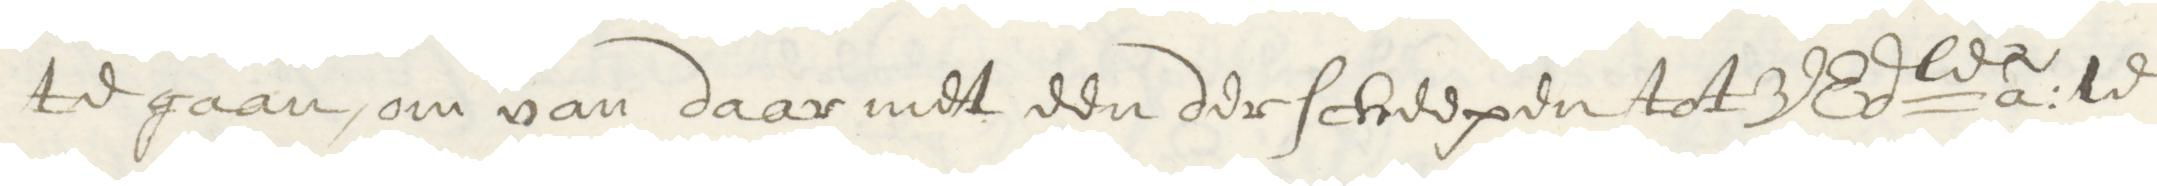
te gaan, om van daar met een der scheepen tot VEd=le a: te
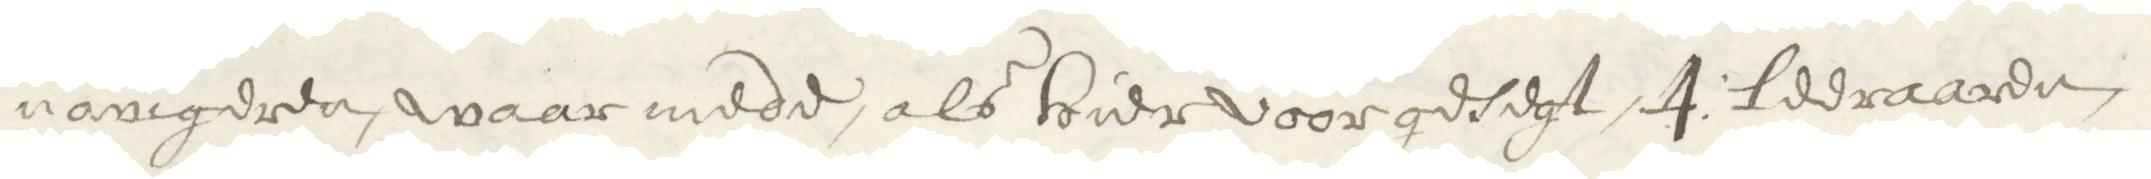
navigeren, waar mede, als hier voor gesegt, 4: leeraaren,
